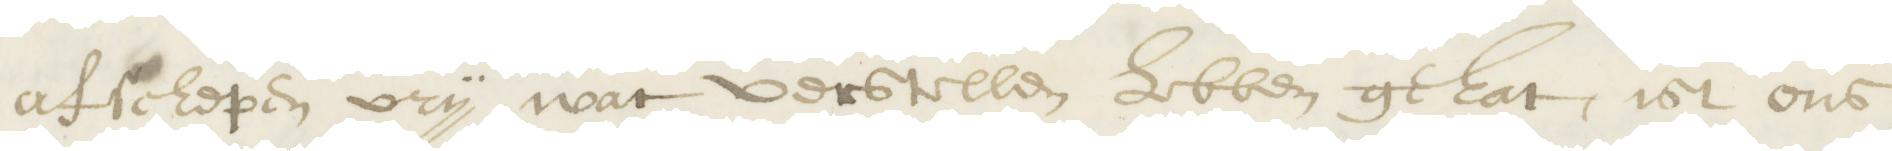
afschepen vrij wat verstellen hebben gehat, ist ons
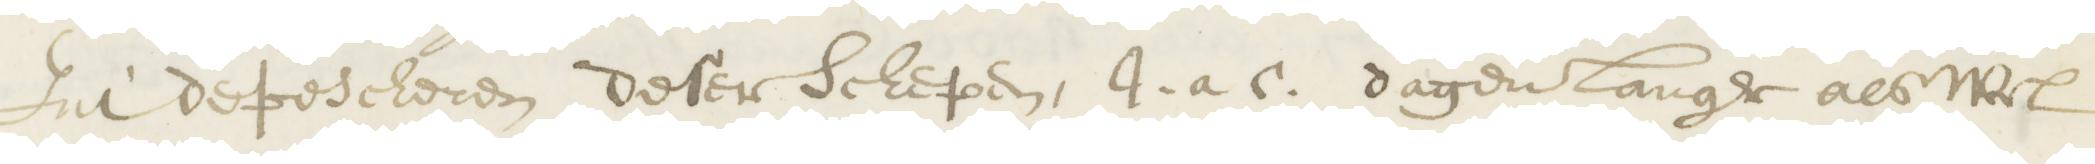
Int' depescheren deser schepen, 4. a 5. dagen langer als wel
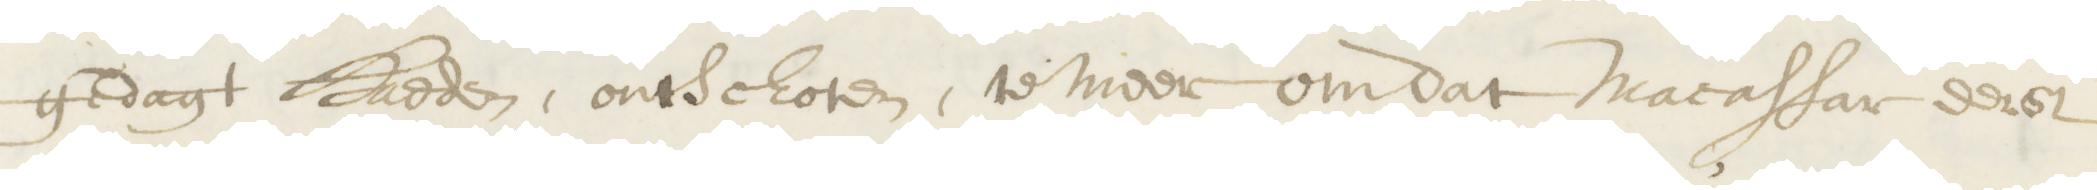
gedagt hadden, ontschoten, te meer om dat Macassar eerst
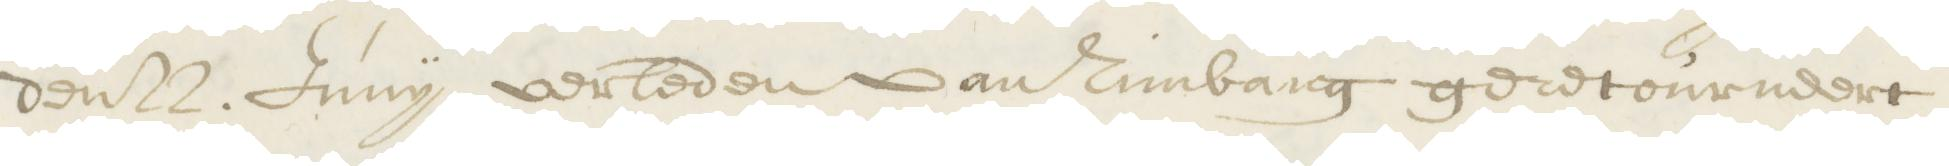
den 22. Iunij verleden van rimbang geretourneert
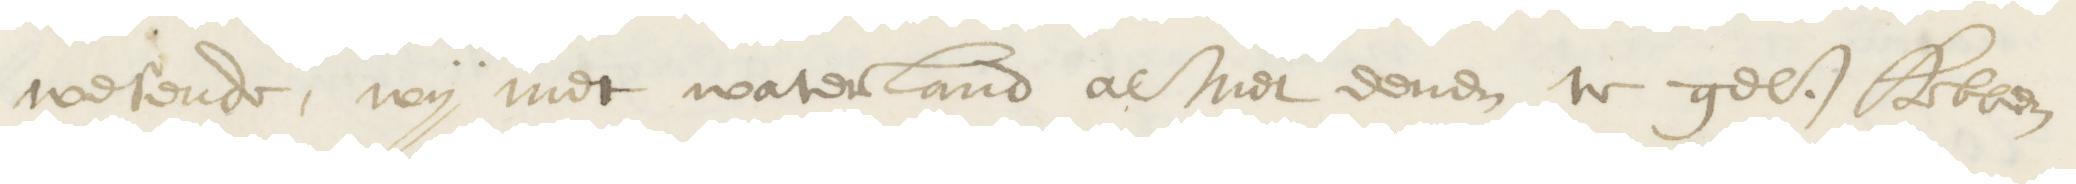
wesende, wij met waterland al met eenen te gelijk hebben
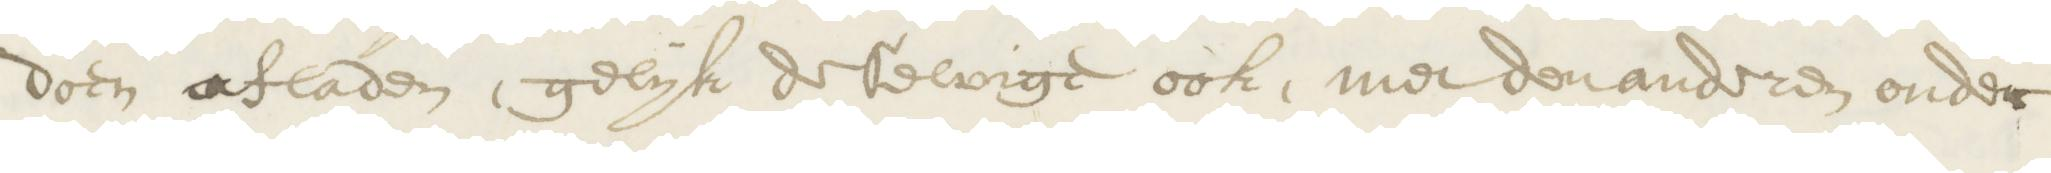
doen afladen, gelijk de selvige ook, met den anderen onder
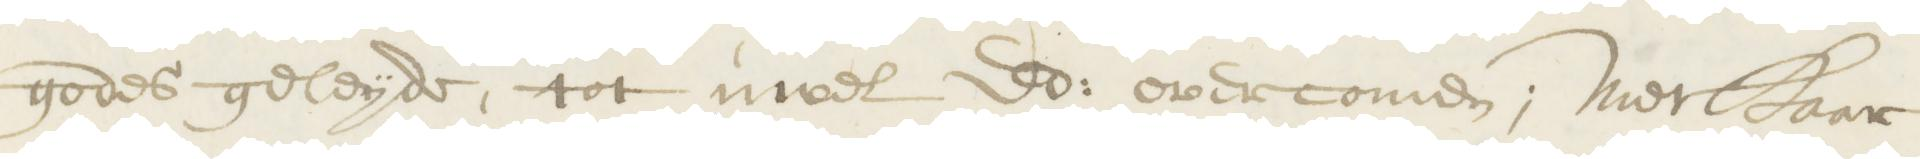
godes geleijde, tot uwel Ed: overcomen; met haar
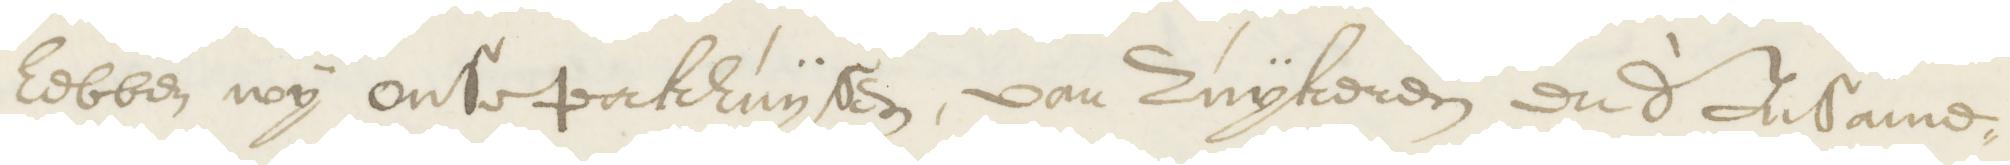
hebben wij onse pakhuijsen, van zuijkeren en d’ Insame„
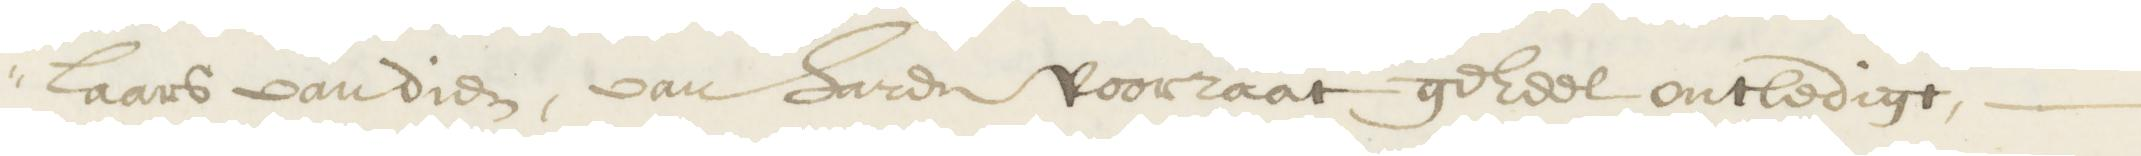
„laars van dien, van haren voorraat geheel ontledigt, —
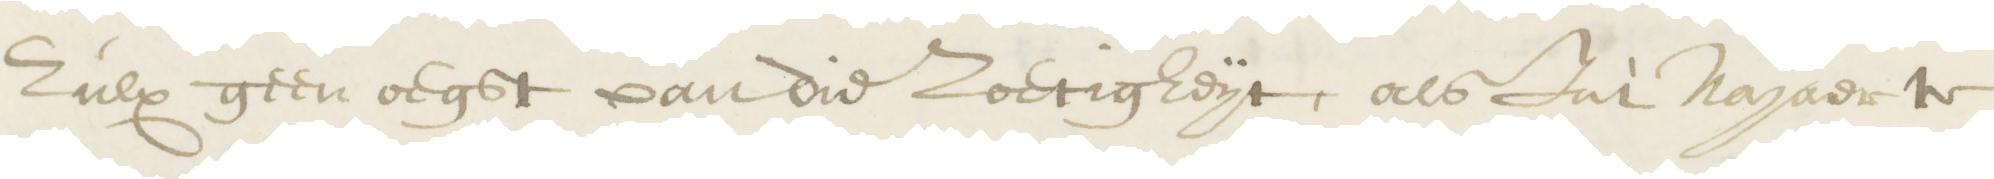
zulx geen oegst van die zoetigheijt, als Int' najaer te
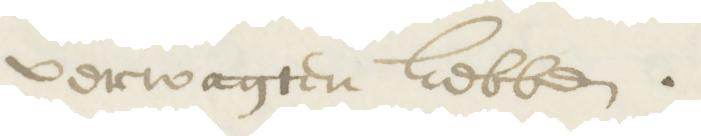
verwagten hebben.
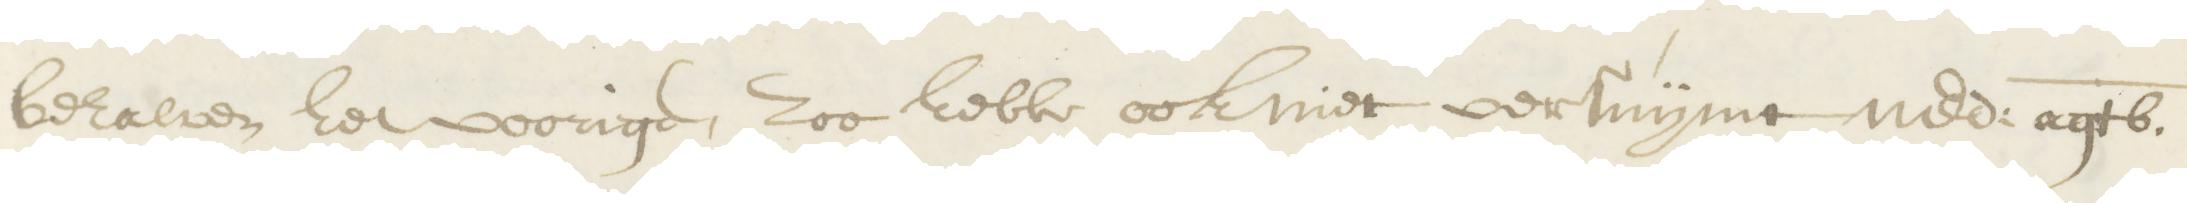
behalven het voorige, zoo hebbe ook niet versuijmt uEd: agtb.
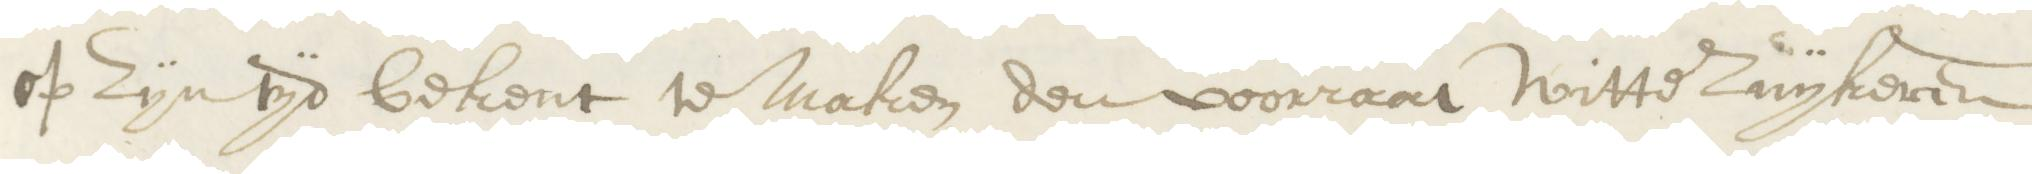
op zijn tijd bekent te maken den voorraat witte zuijkeren
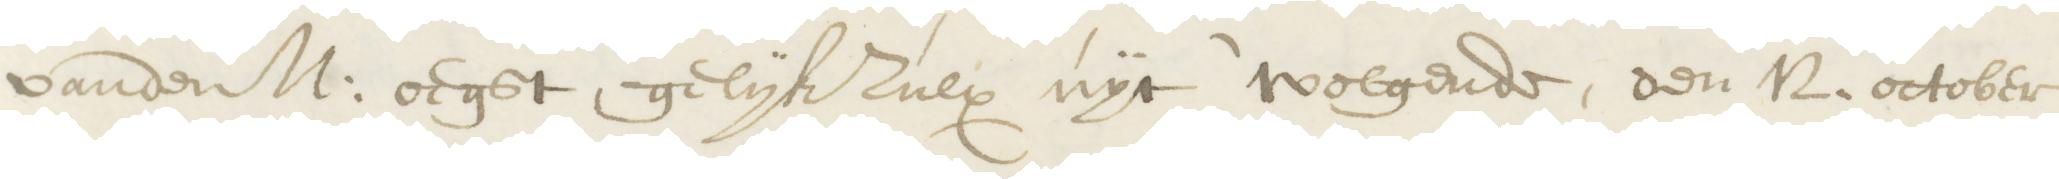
van den 11: oegst gelijk zulx uijt 'tvolgende, den 12. october
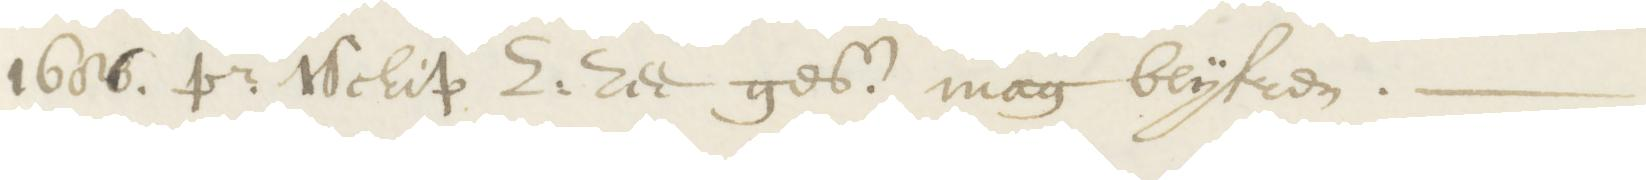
1686. p.r 'tschip z: zee ges: mag blijken. —
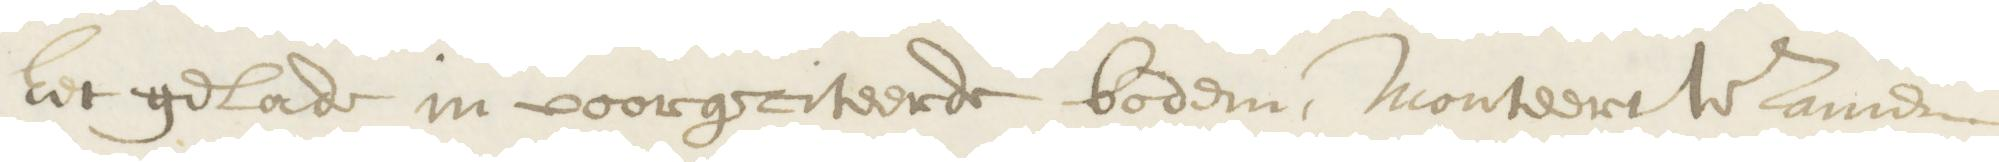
het gelade in voorgeciteerde bodem, monteert te zamen
